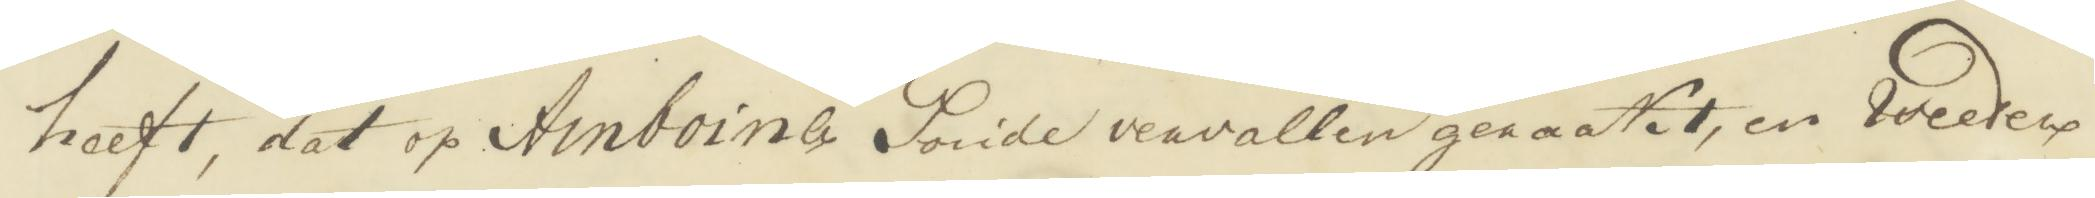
heeft, dat op Amboine soude vervallen geraakt, en weeder
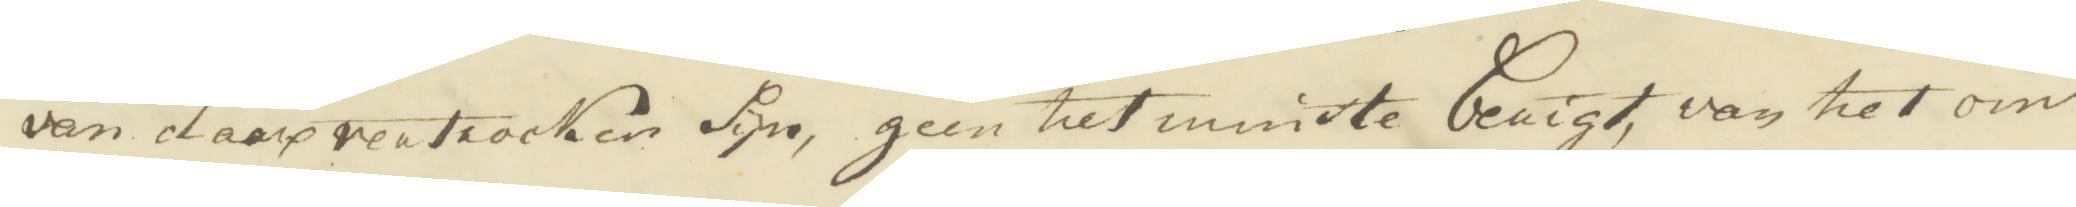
van daar vertrocken sijn, geen het minute berigt, van het om
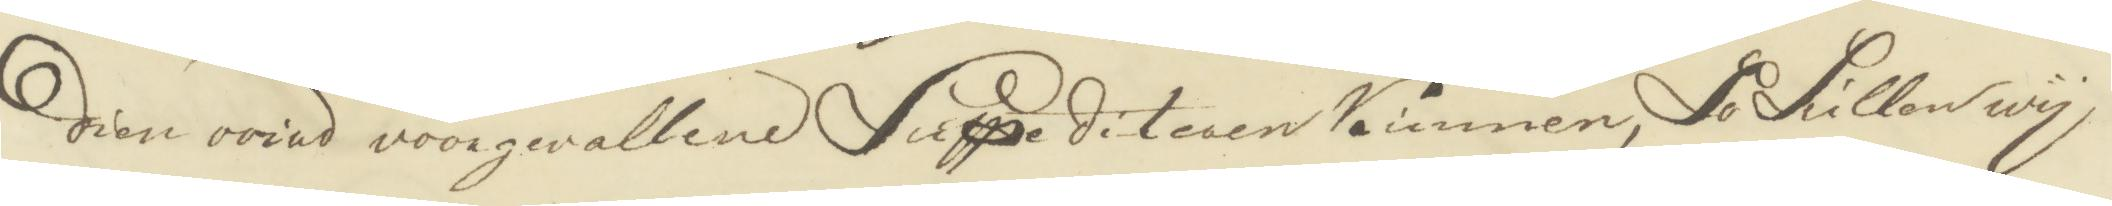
dien ooird voorgevallene Suppediteren kunnen, so sullen wij
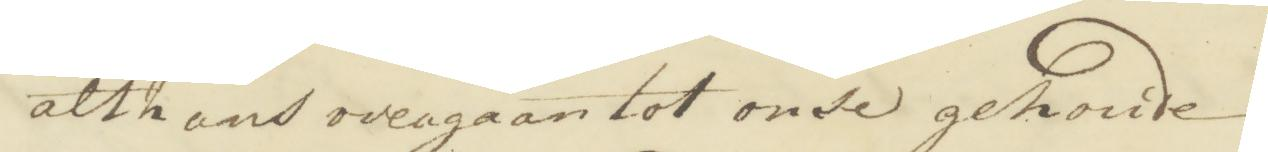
althans overgaan tot onse gehoude
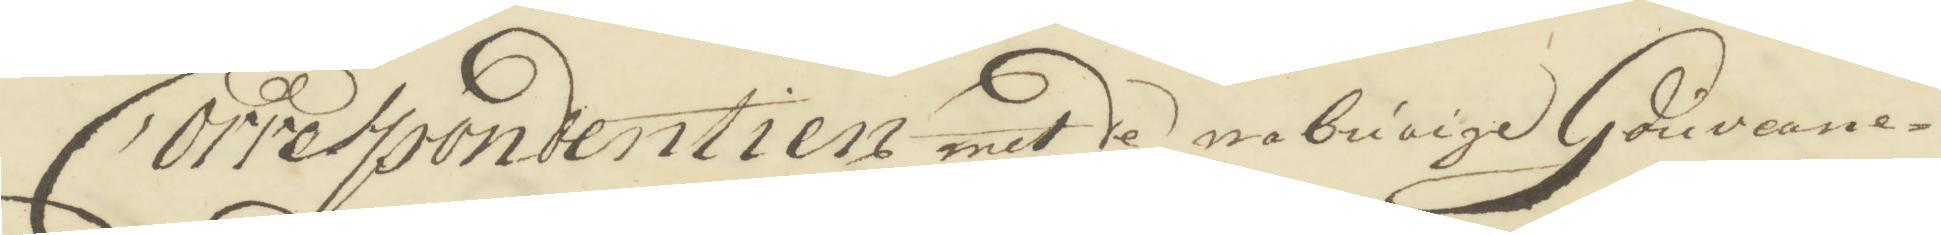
Correspondentien met de naburige Gouverne=
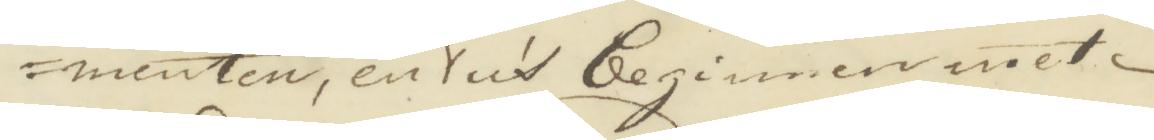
=menten, en dus beginnen met
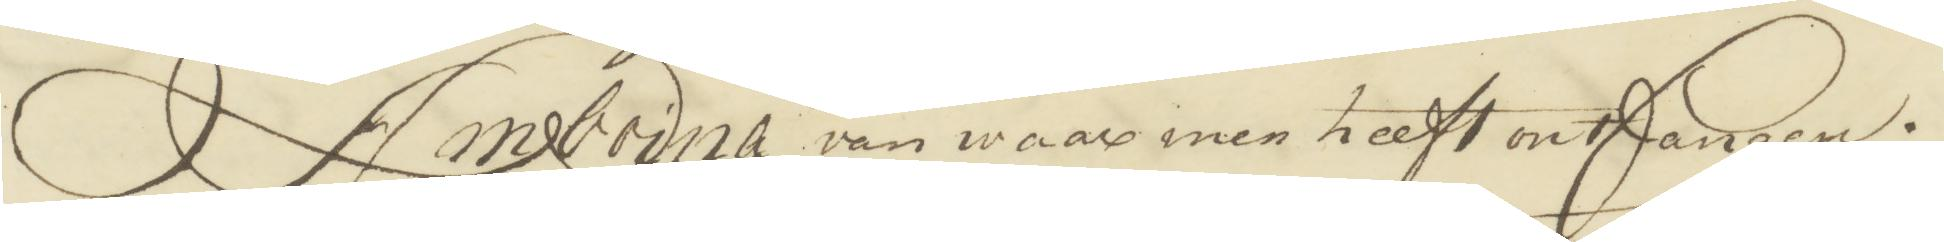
Amboina van waar inen heeft ontfangen.
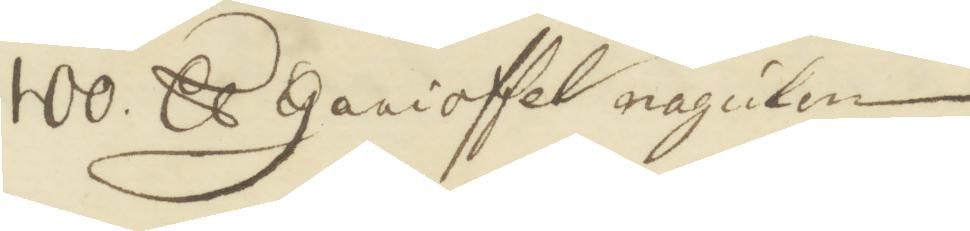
100. lb Garioffel nagulen
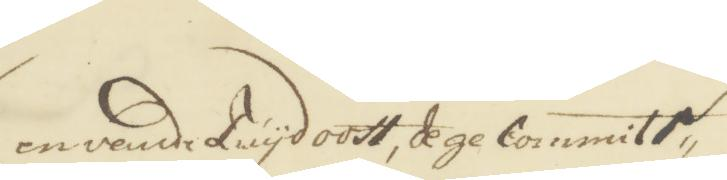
en vande Zuijdoost, de gecommitt„s
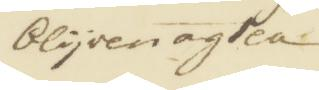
blijven agter
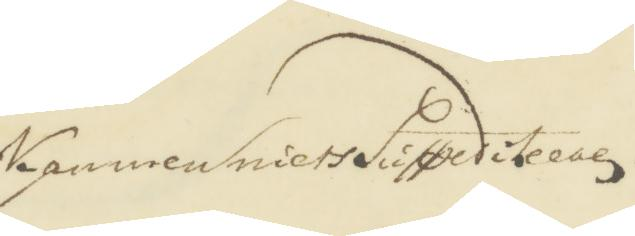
Kanmen niets suppediteeren
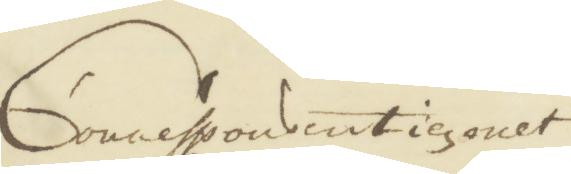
Correspondentien met
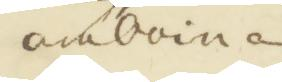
amboina
